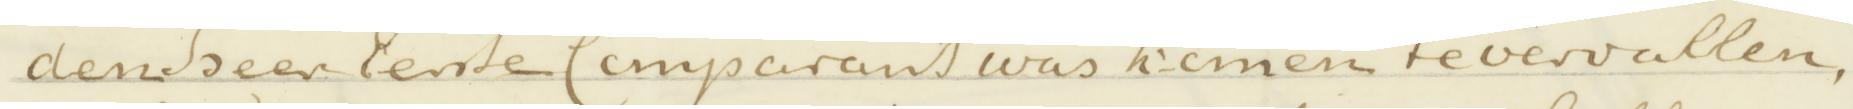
den Heer Eerste Comparant was komen te vervallen,
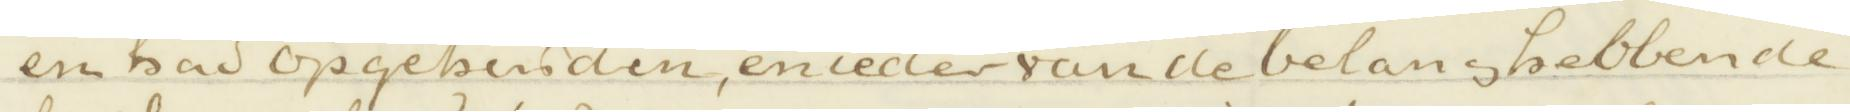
en had opgehouden, en ieder van de belanghebbende
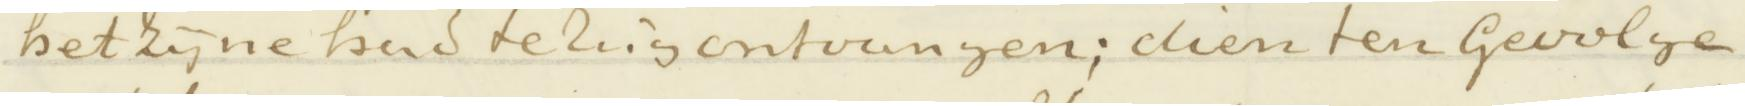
het zijne had terug ontvangen; dien ten Gevolge
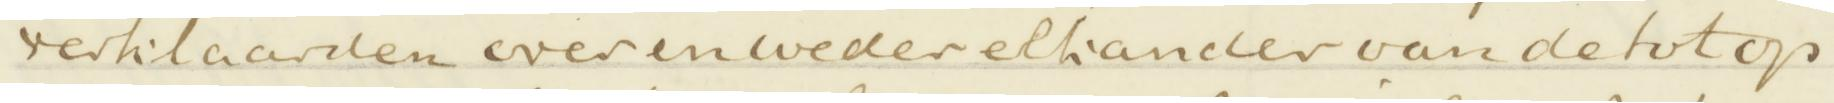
verklaarden over en weder elkander van de tot op
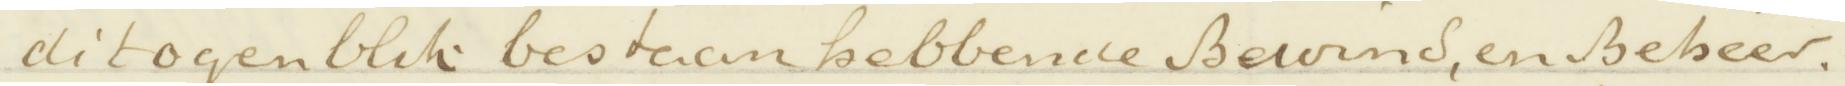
dit ogenblik bestaan hebbende Bewind, en Beheer.
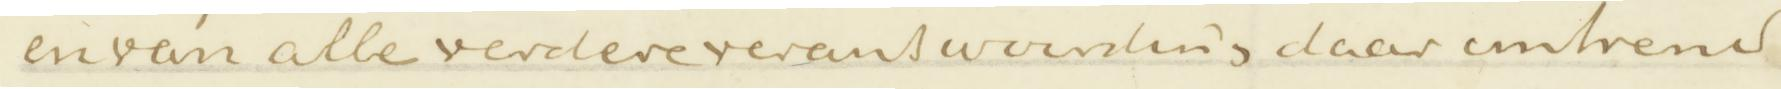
en van alle verdere verantwoording daar omtrend
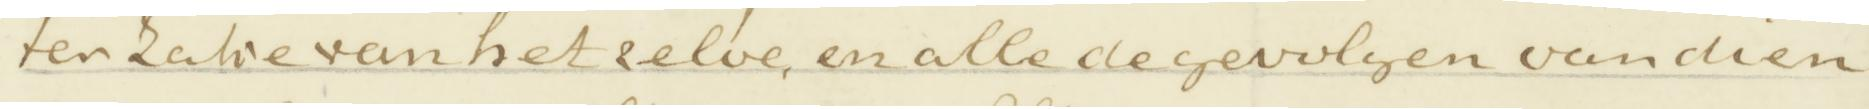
ter zake van het zelve en alle de gevolgen van dien
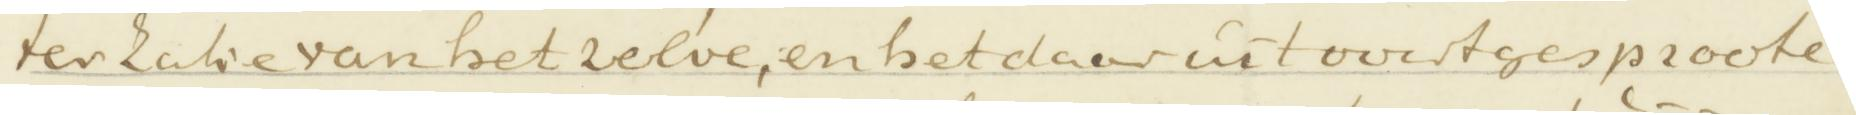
ter zake van het zelve, en het daar uit voortgesproote-
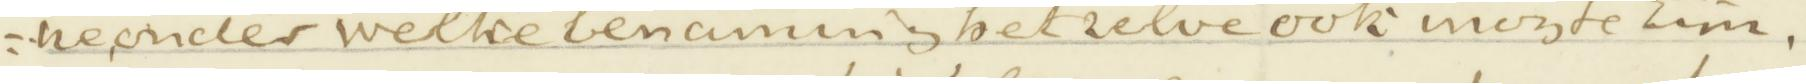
=ne onder welke benaming het zelve ook mogte zijn,
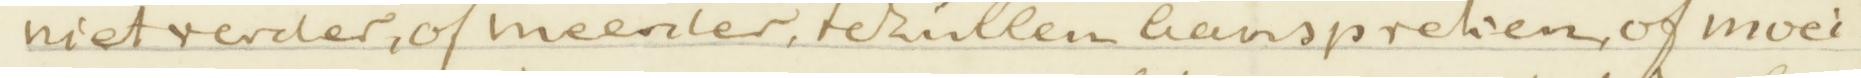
niet verder, of meerder, te zullen aanspreken, of moei
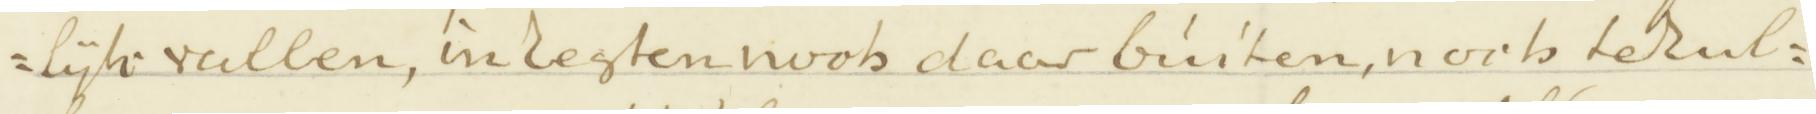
=lijk vallen, in regten noch daar buiten, noch te zul=
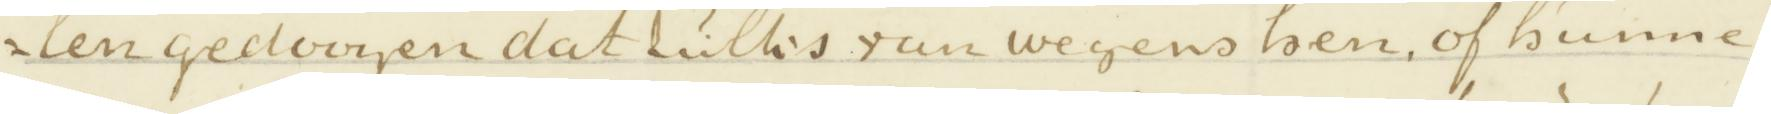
=len gedoogen dat zulks van wegens hen, of hunne
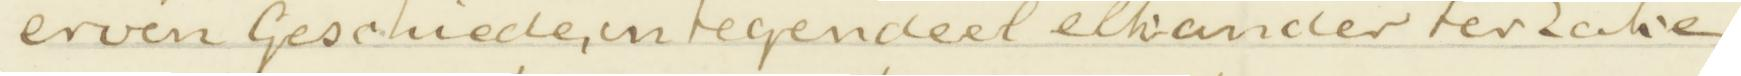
erven Geschiede in tegendeel elkander ter zake
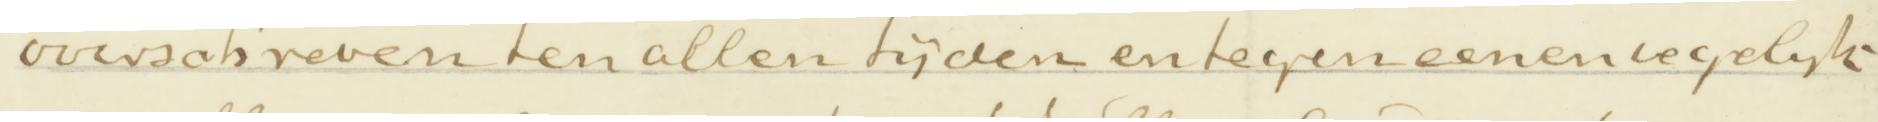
voorschreven ten allen tijden en tegen eenen iegelyk
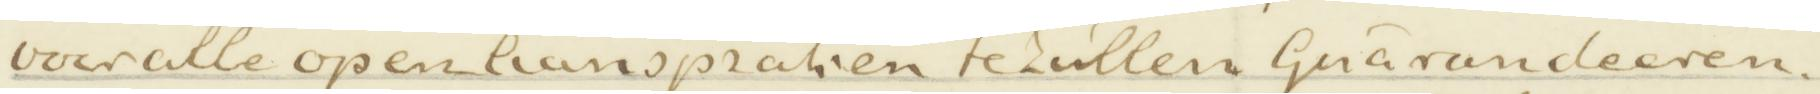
voor alle open aanspraken te zullen Guarandeeren.
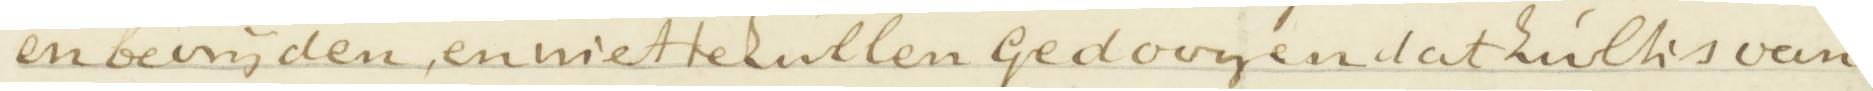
en bevrijden, en niet te zullen gedoogen dat zulks van
